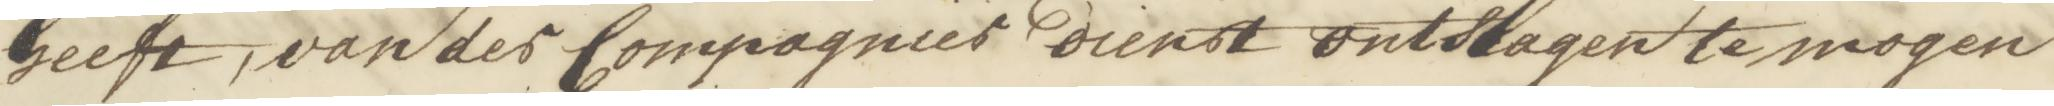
heeft, van des Compagnies dienst ontslagen te mogen
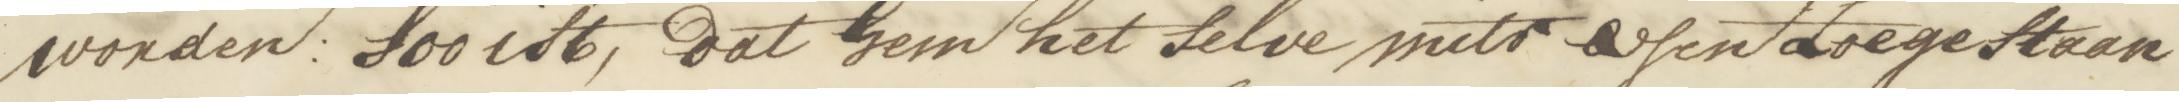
worden: Soo is't, dat hem het selve mits desen toegestaan
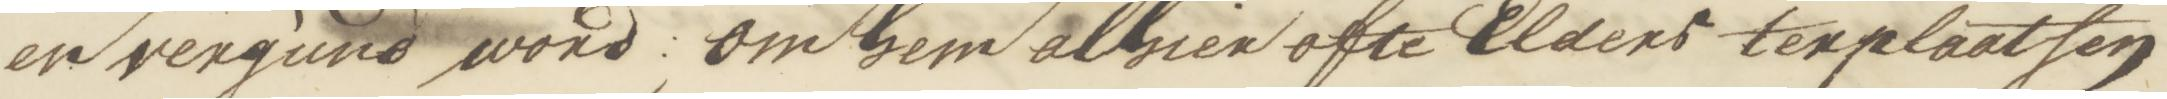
en vergund word: om hem alhier ofte Elders ter plaatsen
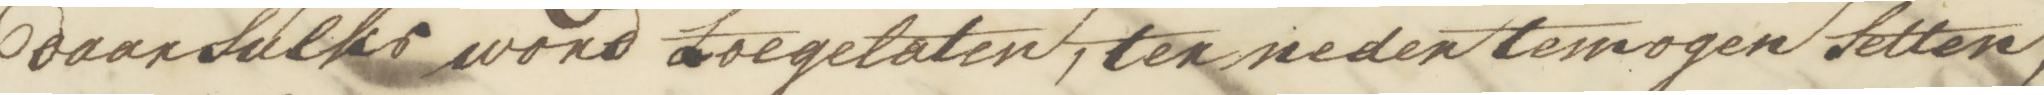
daarsulks word toegelaten, ten neder te mogen setten,
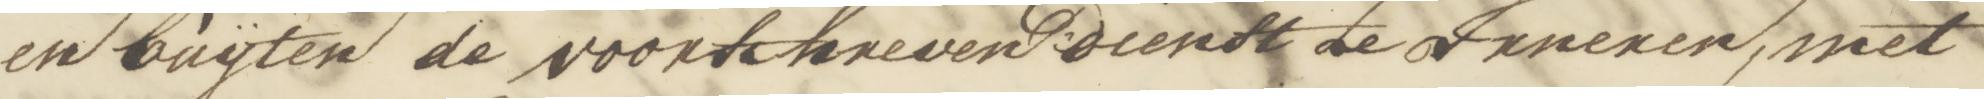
en buijten de voorschreven dienst te Erneren, met
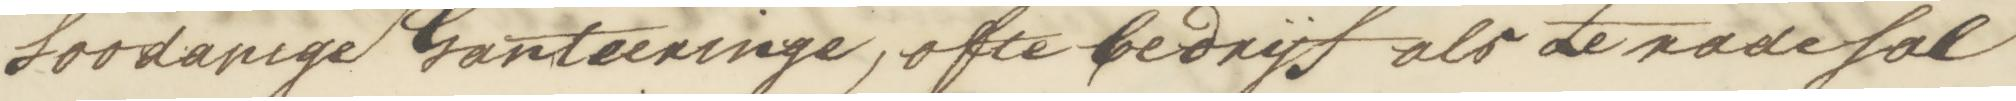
soodanige hanteeringe, ofte bedrijft als te rade sal
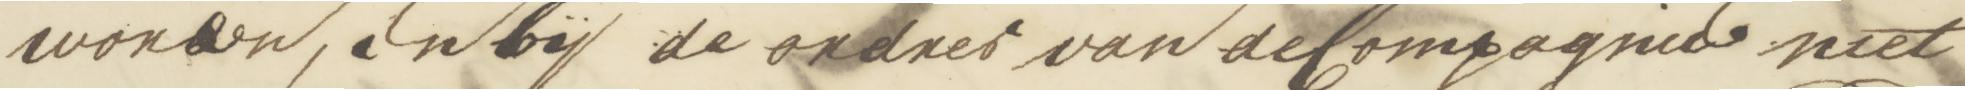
worden, en bij de ordres van de Compagnie niet
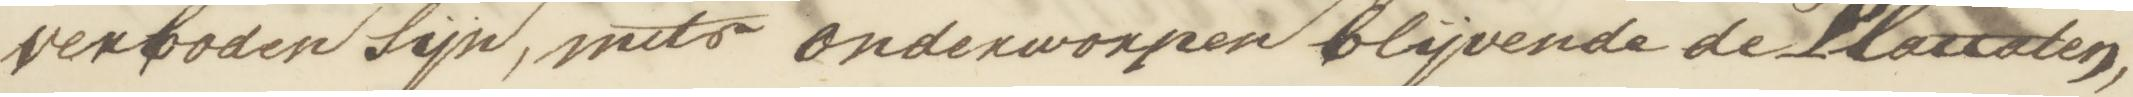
verboden sijn, mits onderworpen blijvende de Placcaten,
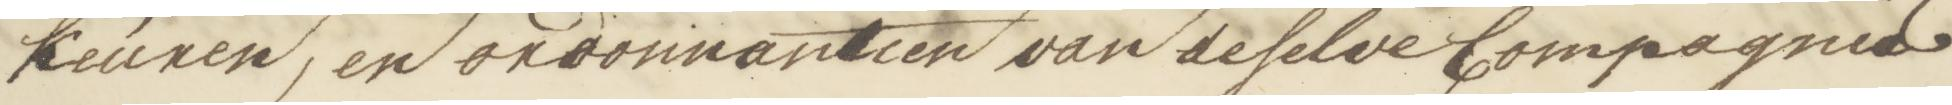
kueren, en ordonnantien van deselve Compagnie
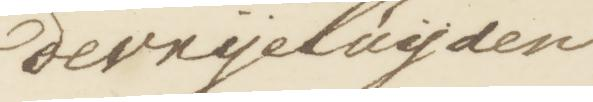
de vrijeluijden
